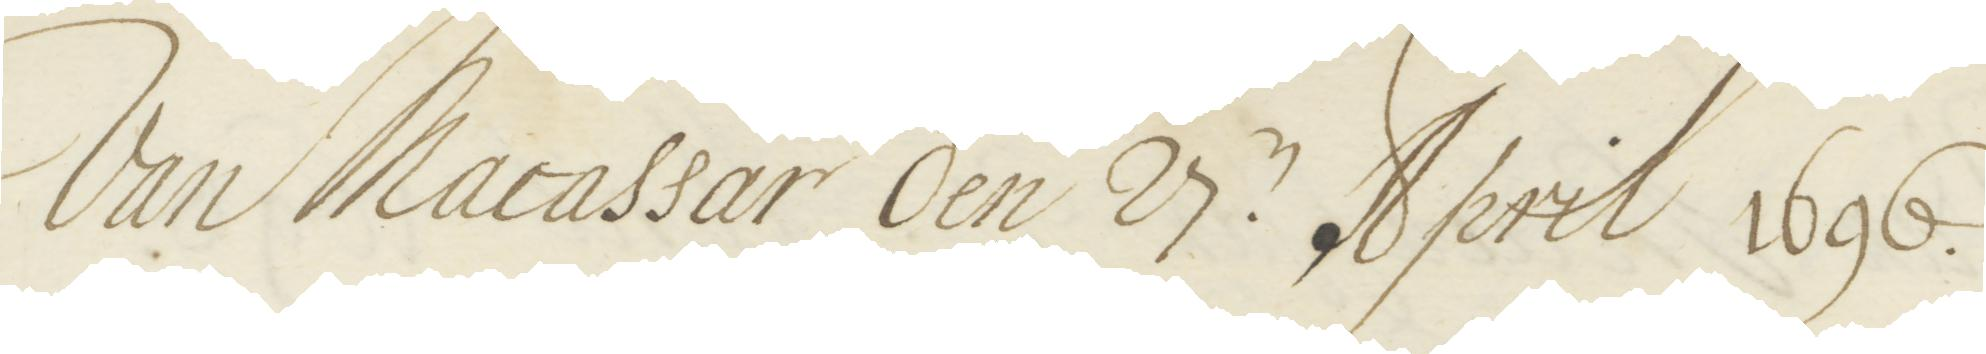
Van Macassar den 27:n April 1696.
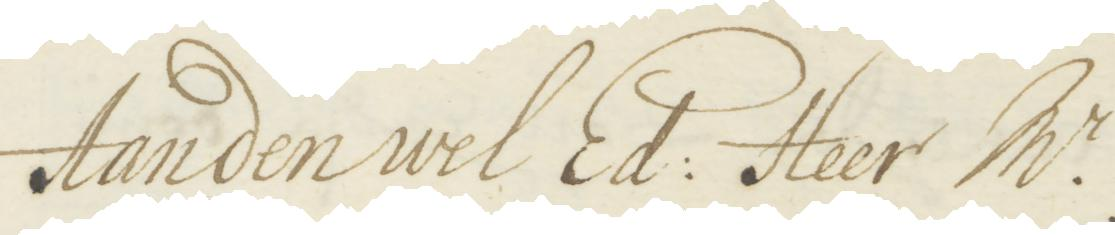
Aan den wel Ed: Heer M.r
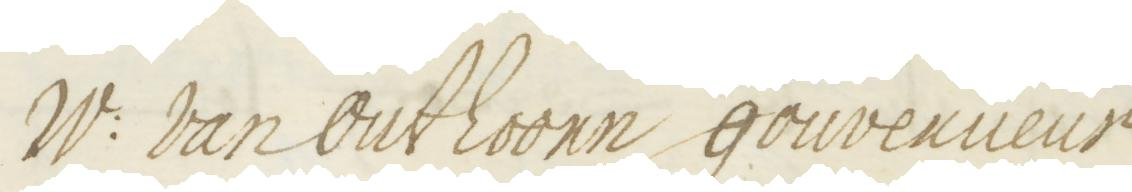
W: Van Outhoorn gouverneur
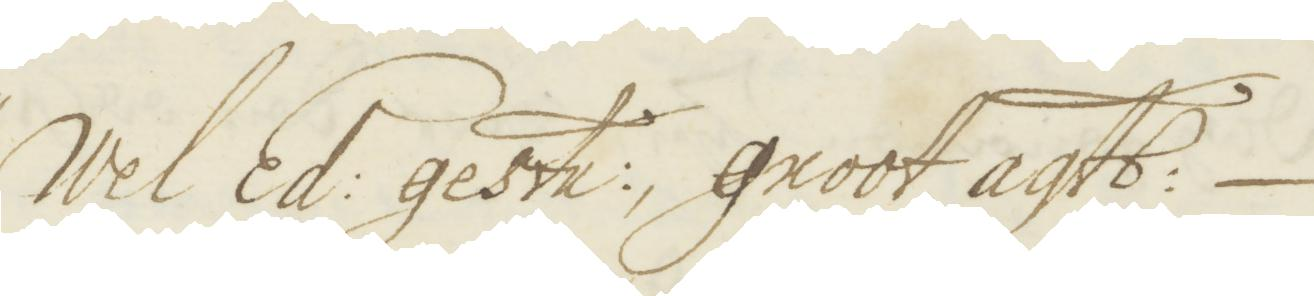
wel Ed: gestr:, groot agtb: —
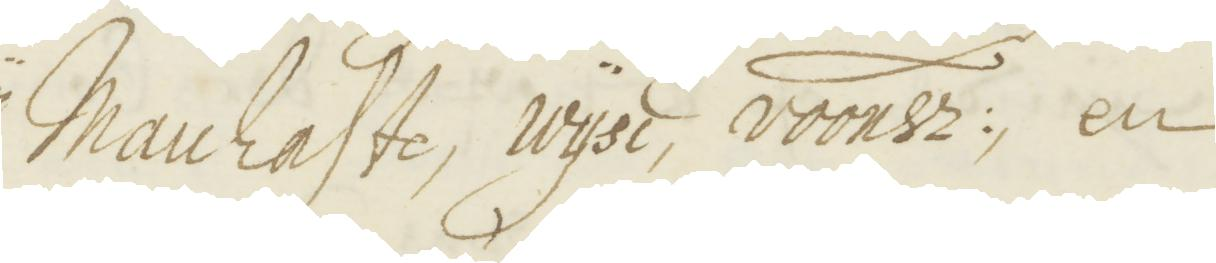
Manhafte, wijse, voorsz:, en
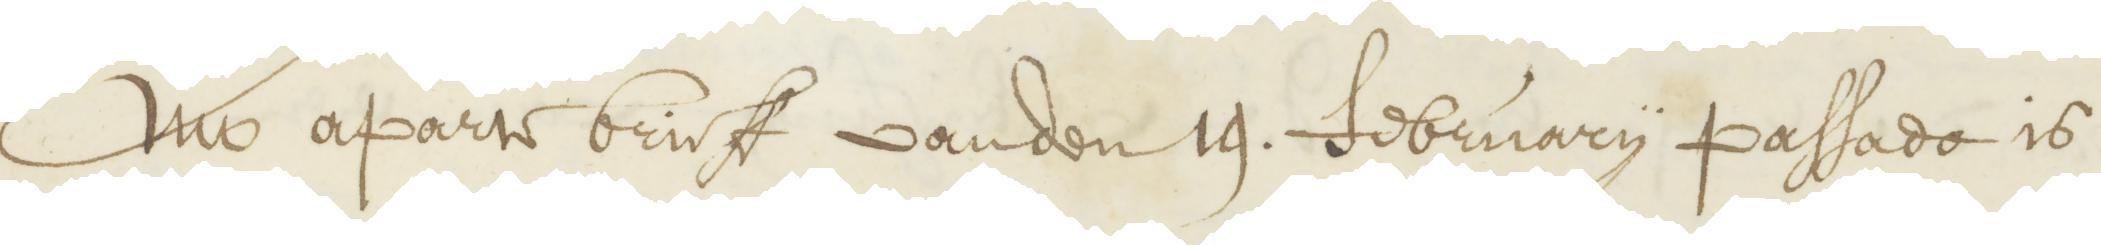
Uw aparte brieff vanden 19. Februarij passado is
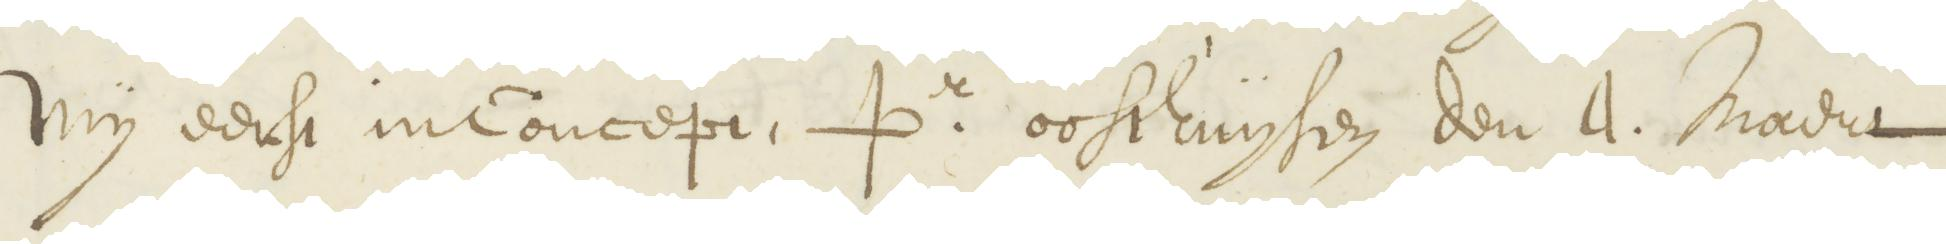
Mij eerst in Concept, P.r oosthuijsen den 4. Maert
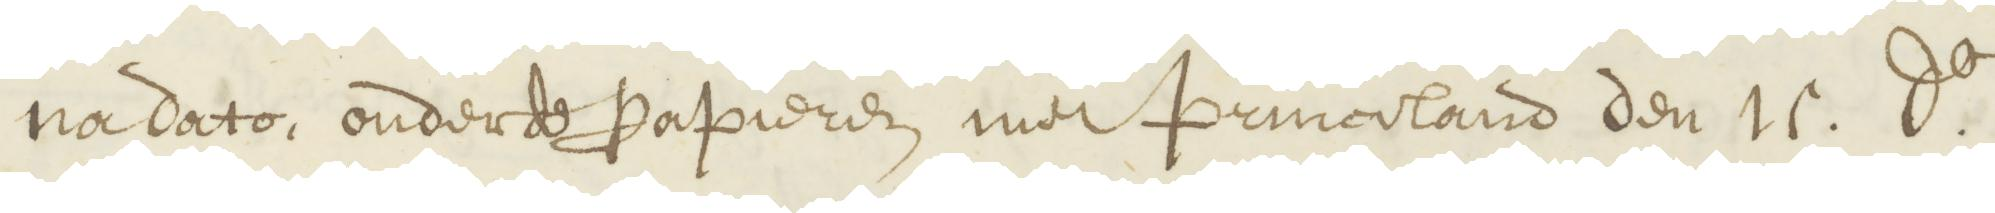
na dato, onder de papieren met princeland den 15. d.o
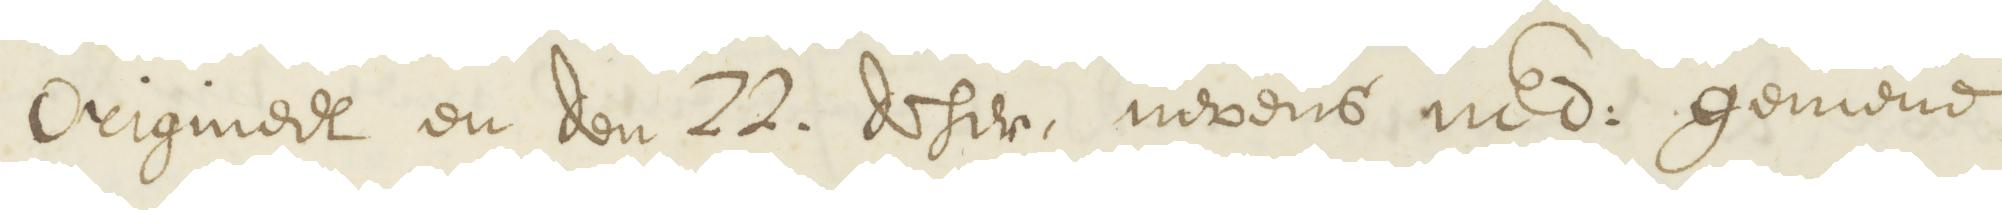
Origineel en den 22. deser, nevens uEd: gemene
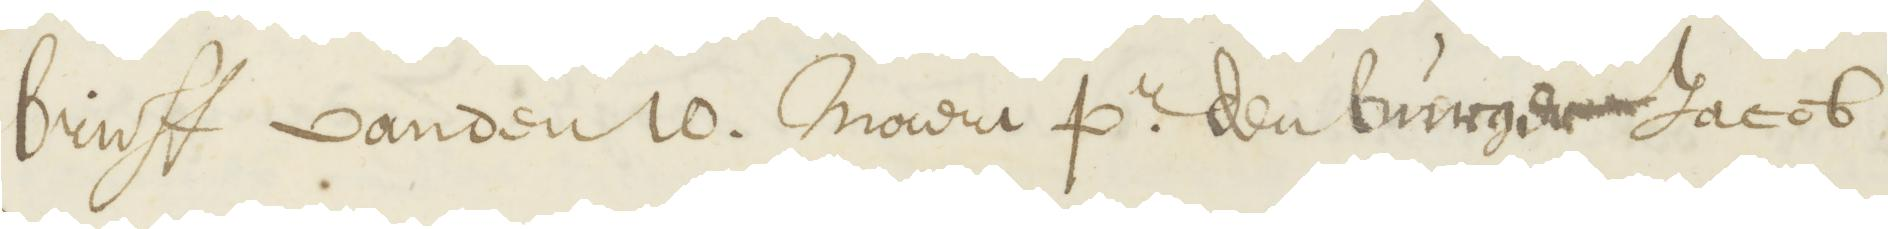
brieff vanden 10. Maert p.r den burger Iacob
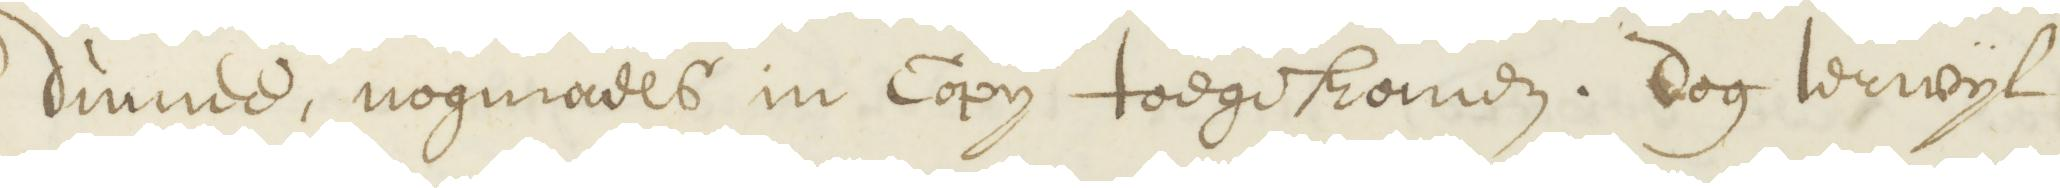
dinnee, nogmaels in Copij toegekomen. dog terwijl
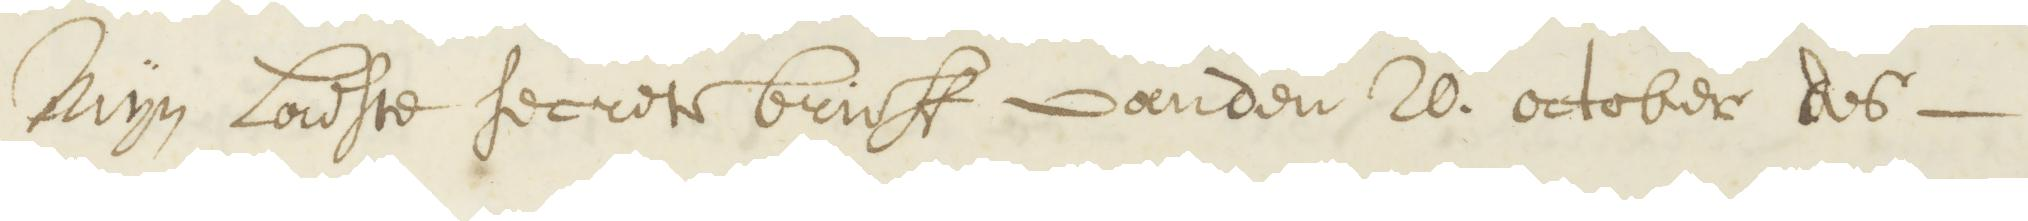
Mijn laeste secrete brieff van den 20.en october des —
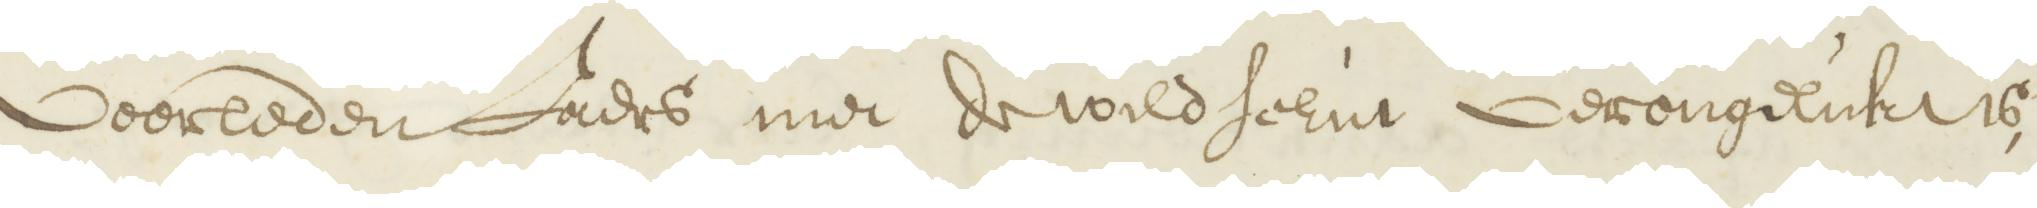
Voorleden Iaers met de wildschut verongelukt is,
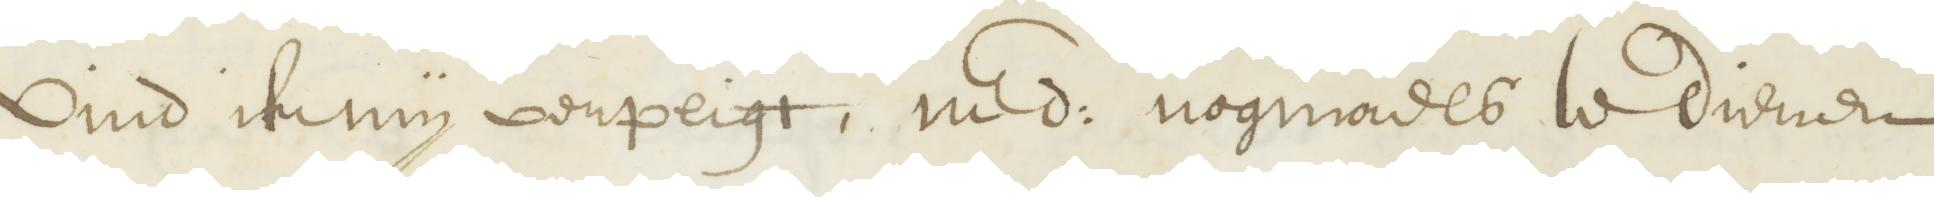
Vind ik mij verpligt, uEd: nogmaels te dienen
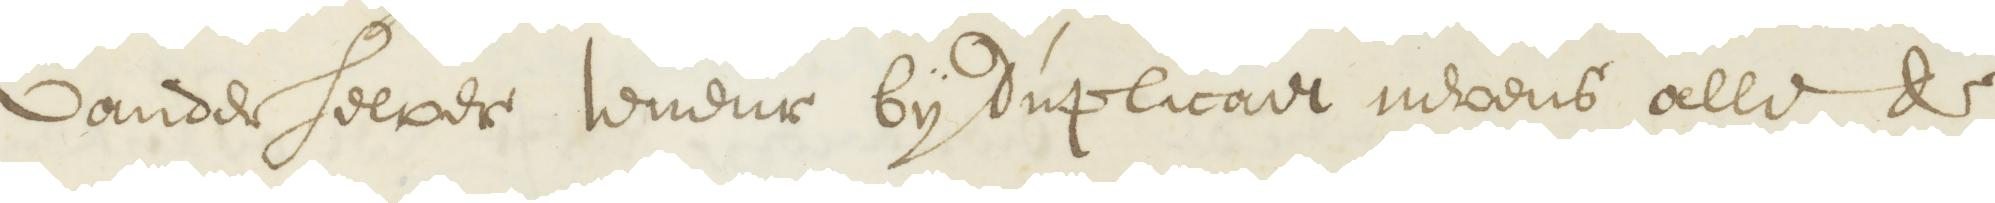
Vander selver teneur bij duplicaet nevens alle de
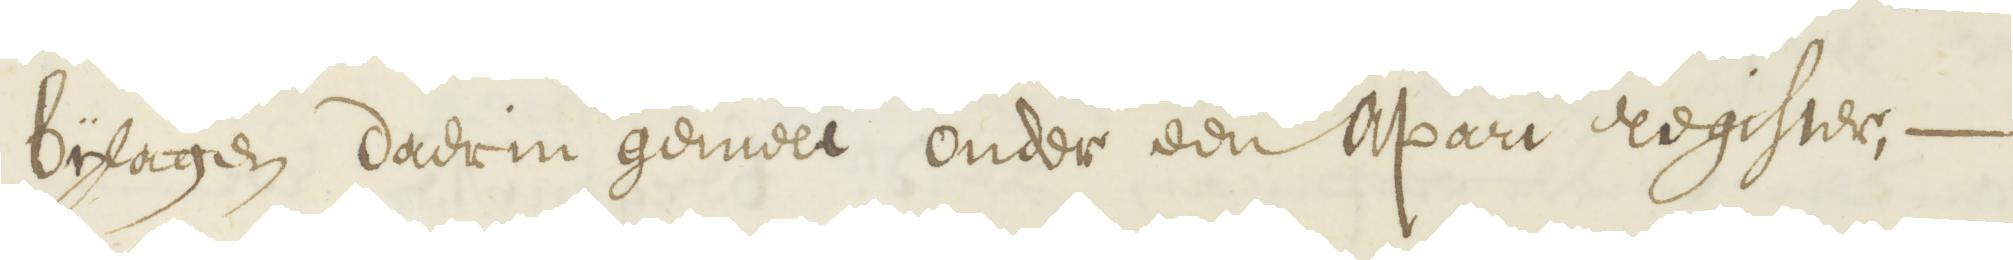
bijlagen daerin gemelt onder een Apart register, —
